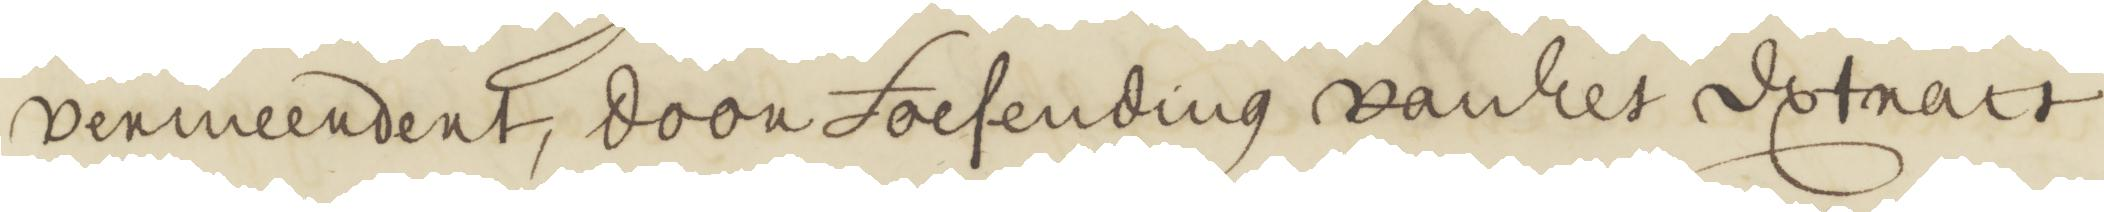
vermeerdert, door toesending van het extract
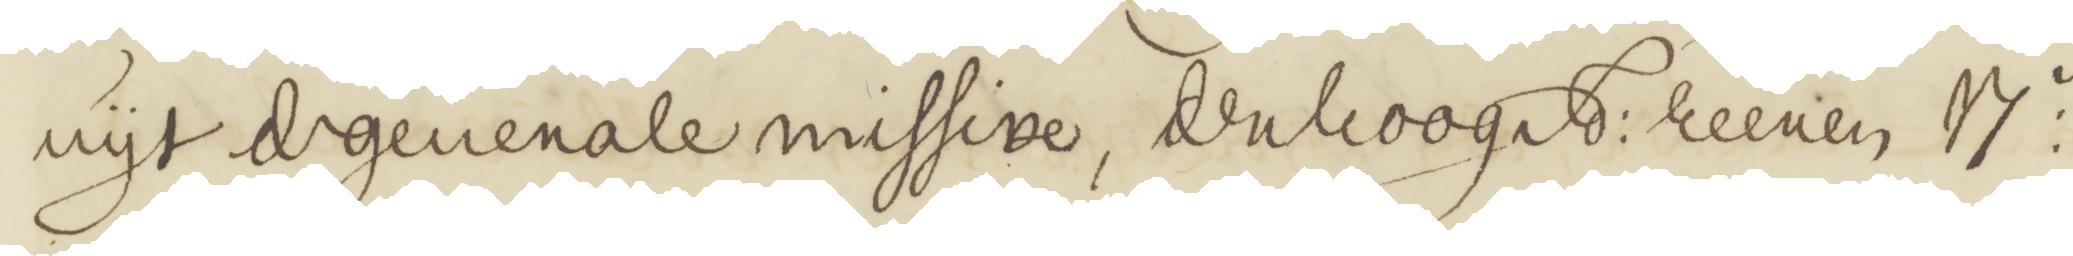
uijt de generale missive, der hoog Ed: heeren 17:'
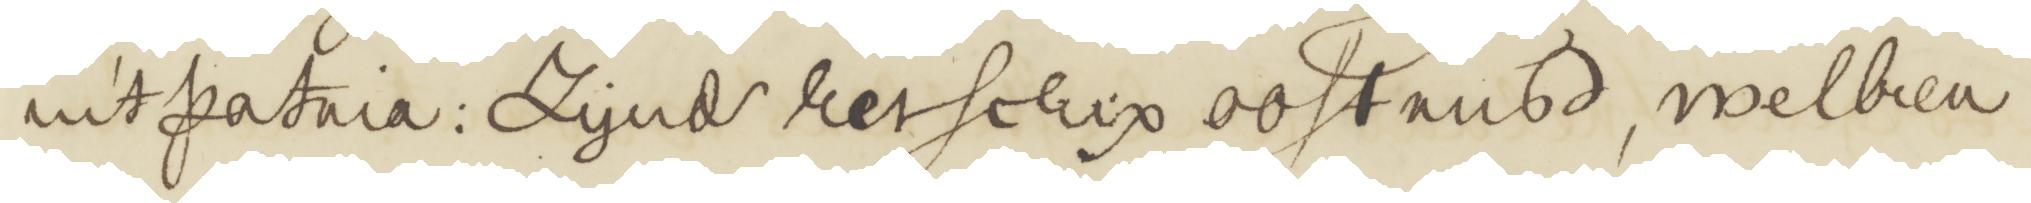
in’t patria: Zijnde het schip oostrust, welken
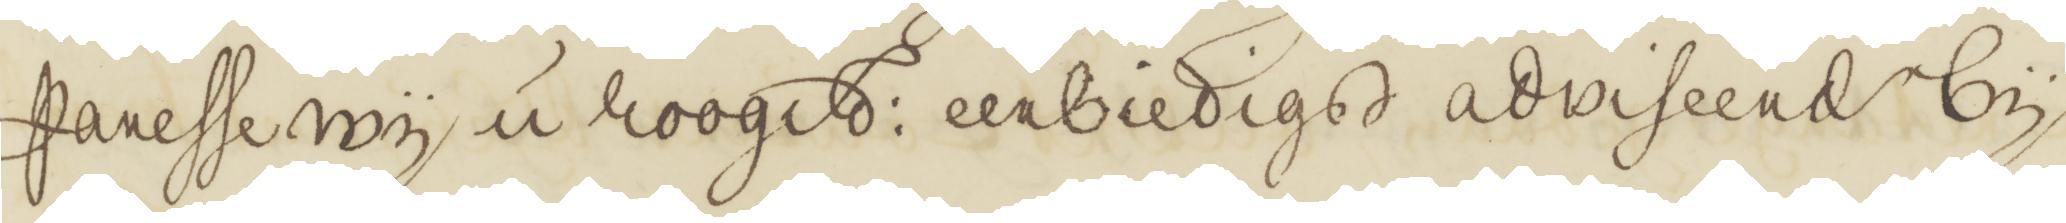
paresse wij u hoog Ed: eerbiedigst adviseerde bij
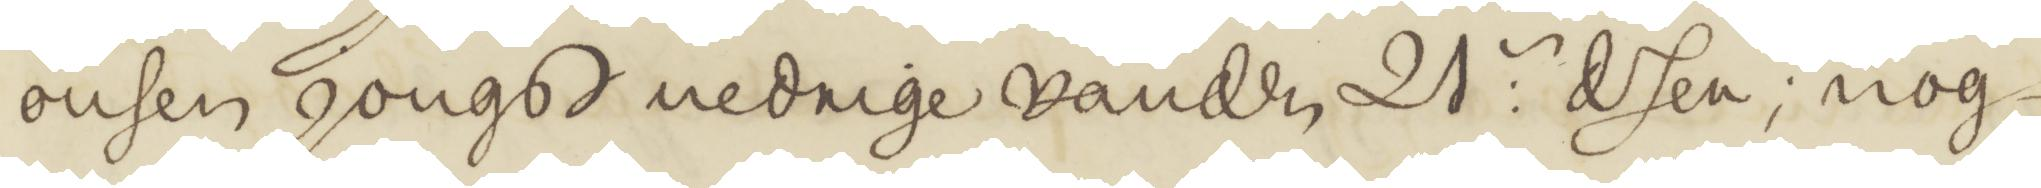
onsen jongst nedrige vanden 21:' desen; nog
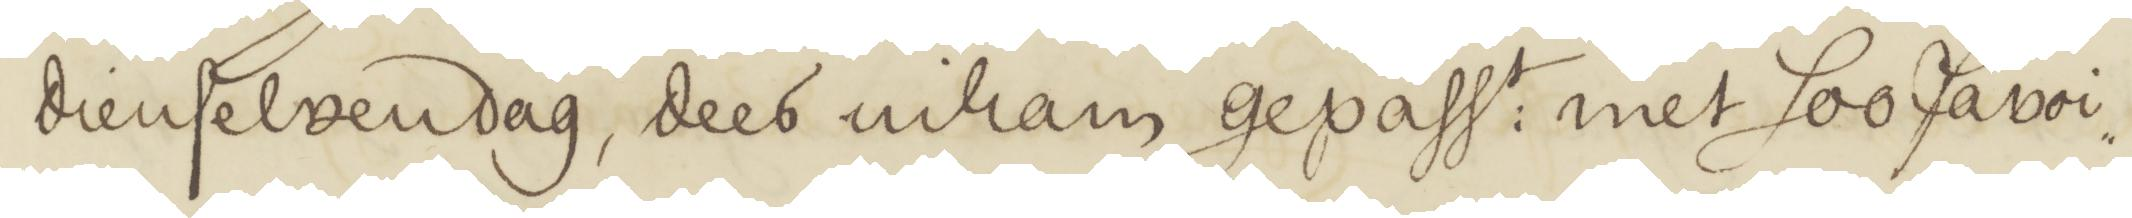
dienselven dag, dees inham gepass:t met soo favoi„
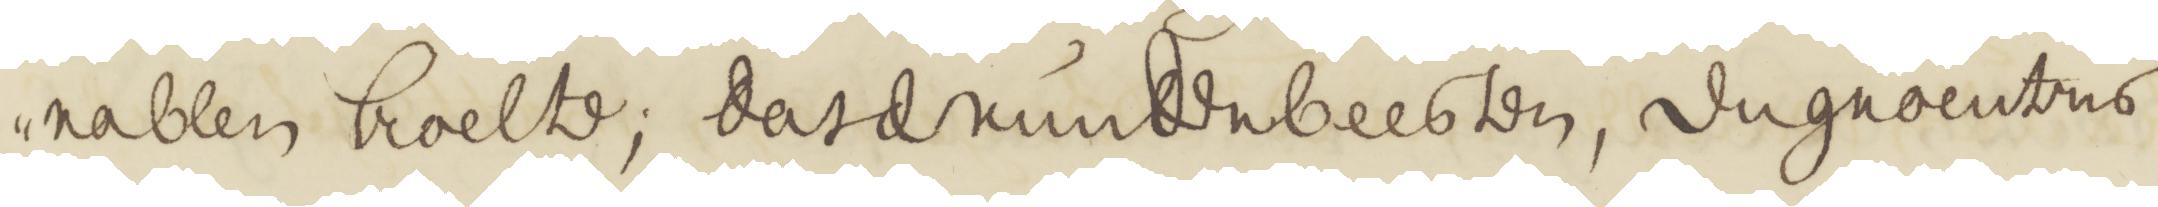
„rablen koelte; dat drunderbeesten, en groentens
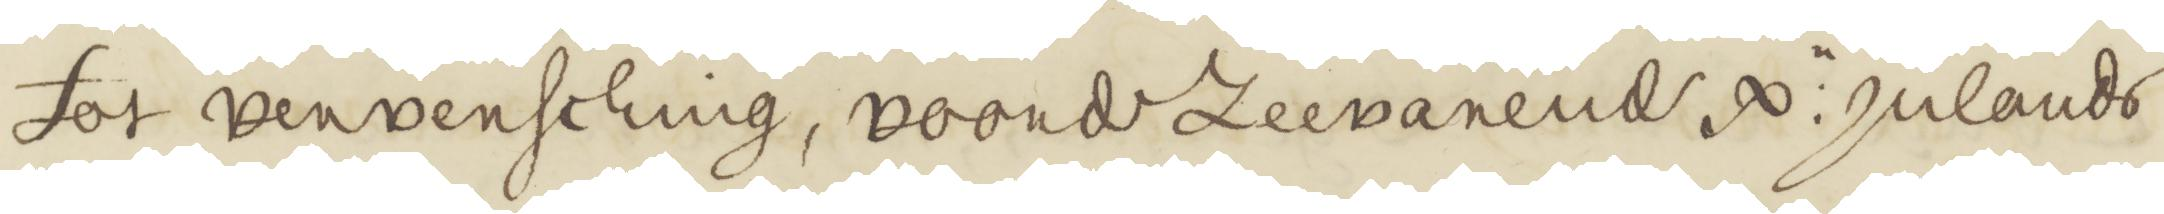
tot verversching, voor de zeevarend p:r jnlands
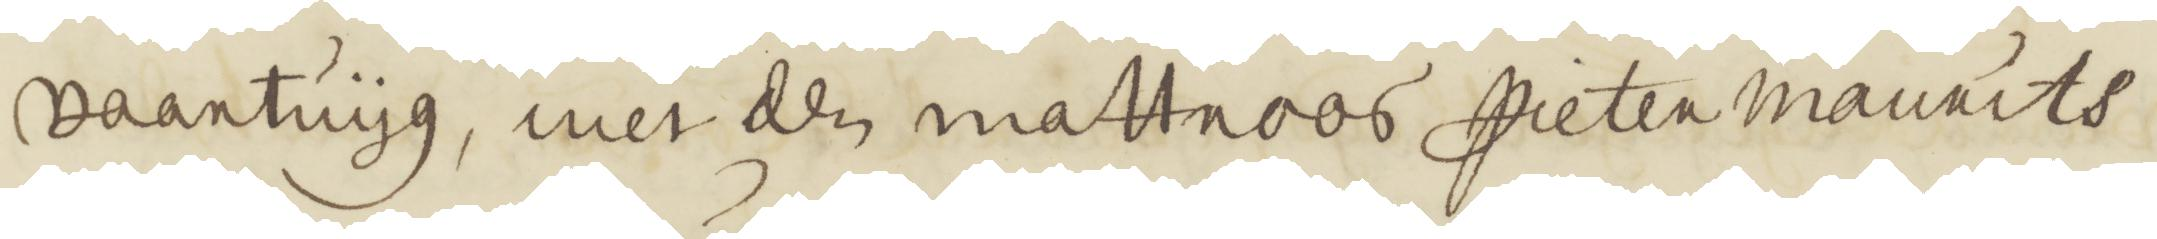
vaartuijg, met den mattroos Pieter maurits
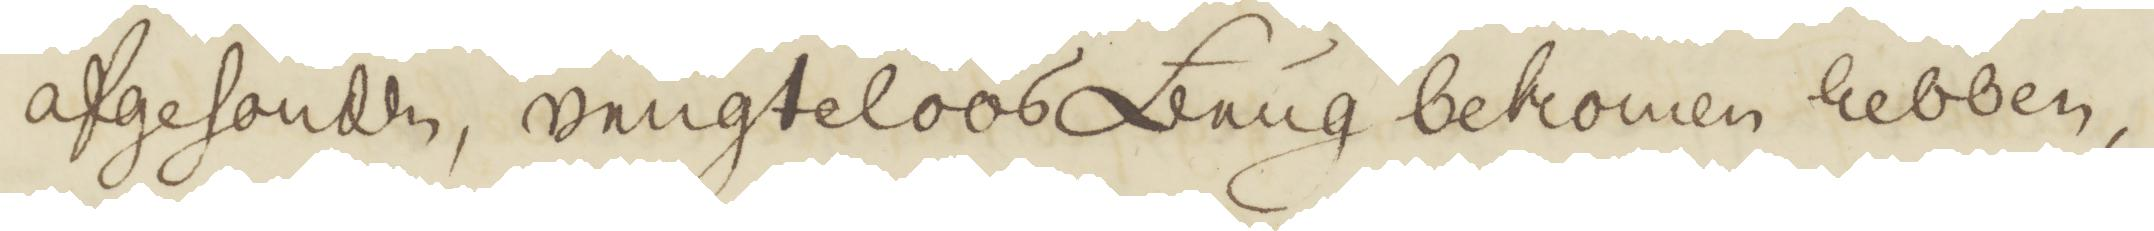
afgesonden, vrugteloos terug bekomen hebben,
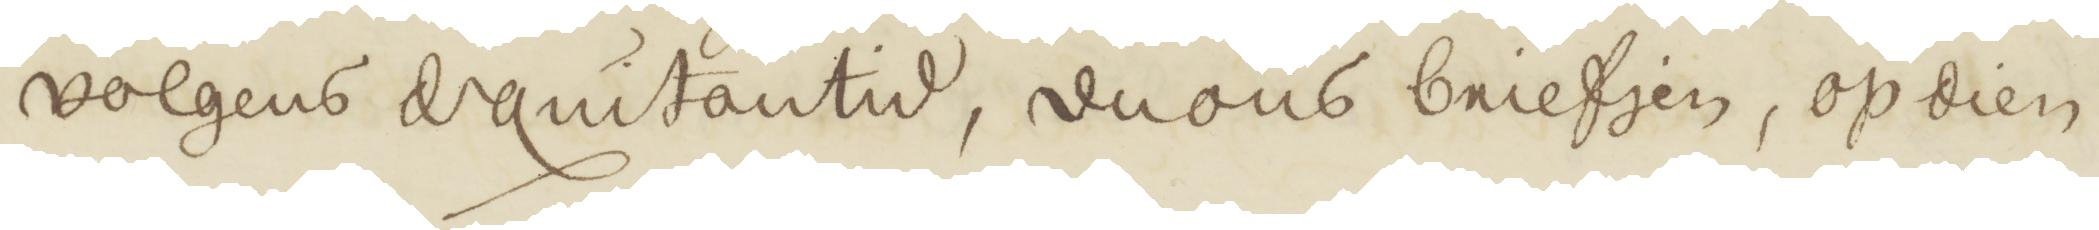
volgens de quitantie, en ons briefjen, op dien
